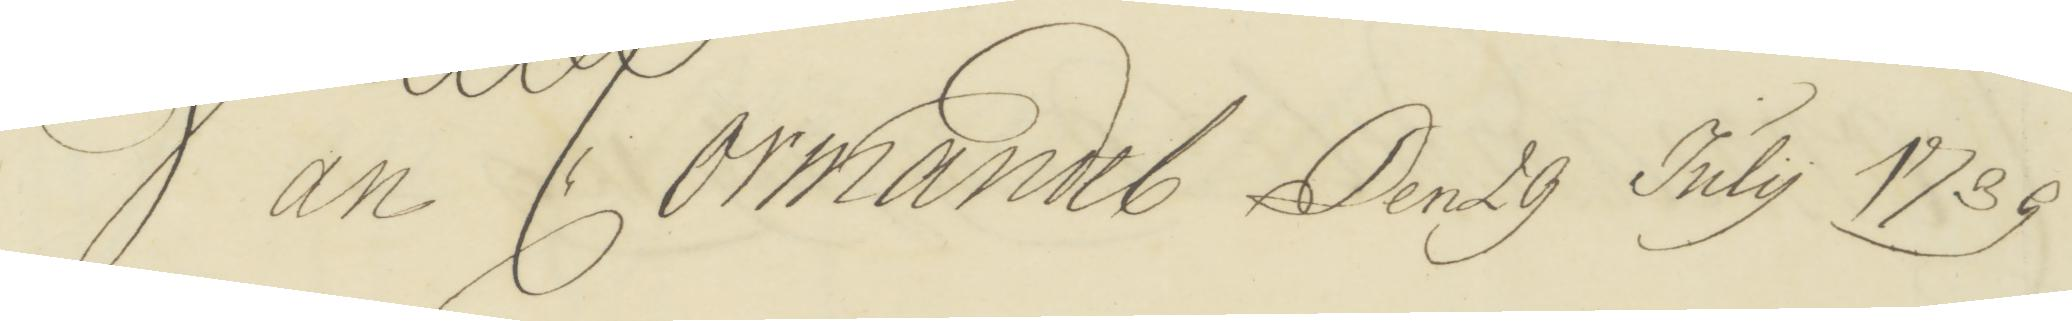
Van Cormandel Den 29 Iulij 1739
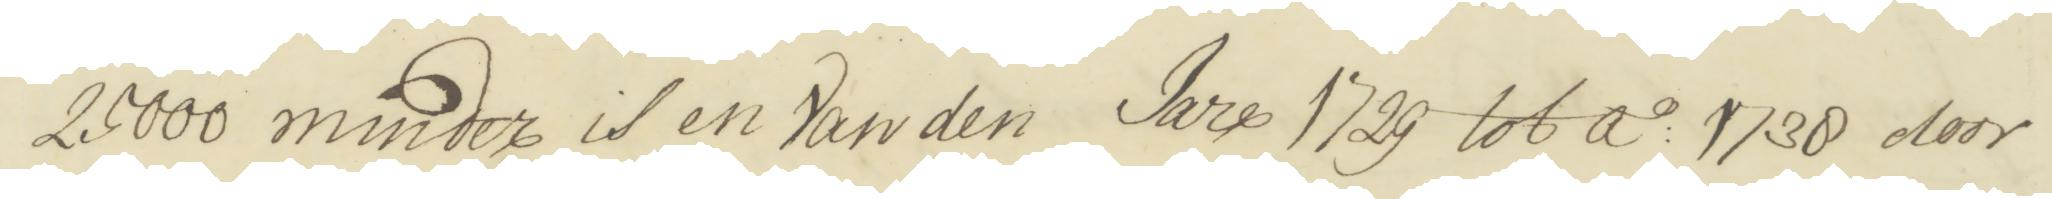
25000 minder is en van den Iare 1729 tot a:o 1738 door
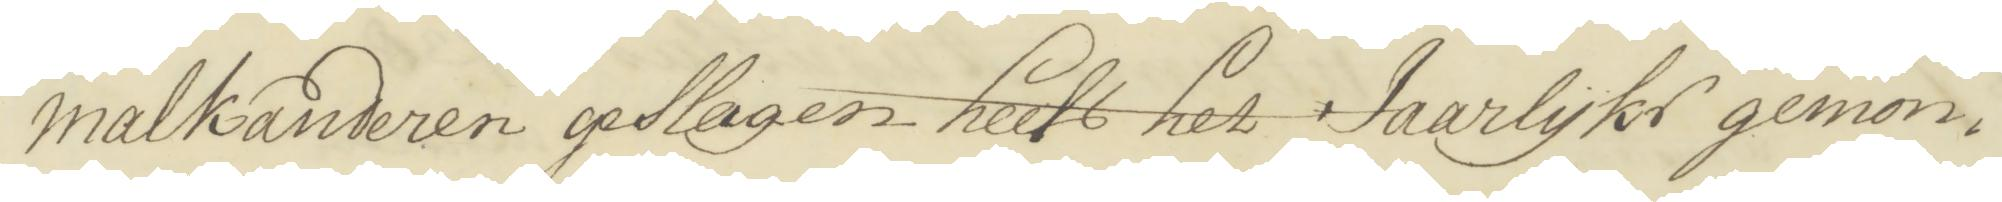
malkanderen geslagen heeft het Iaarlijks gemon„
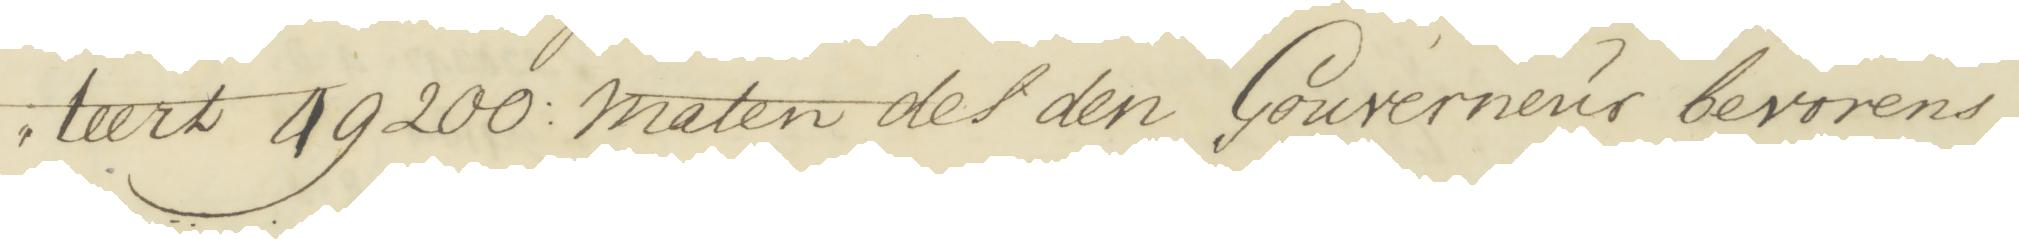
„teert 49200: maten des den Gouverneur bevorens
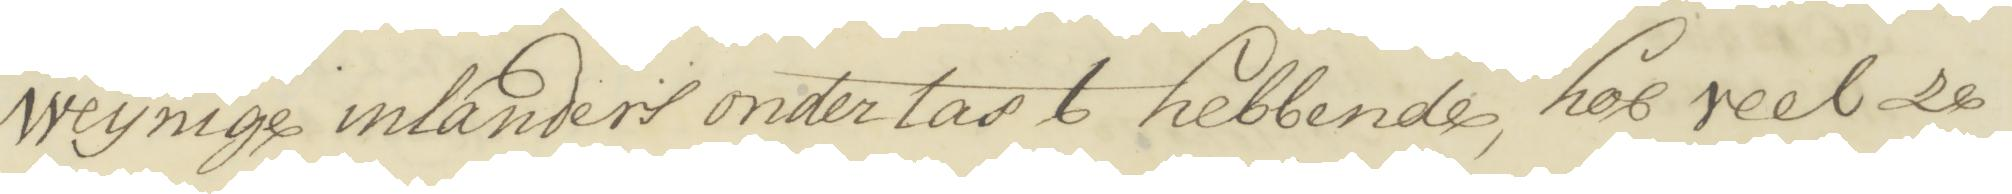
weijnige inlanders onder last hebbende, hoe veel ze
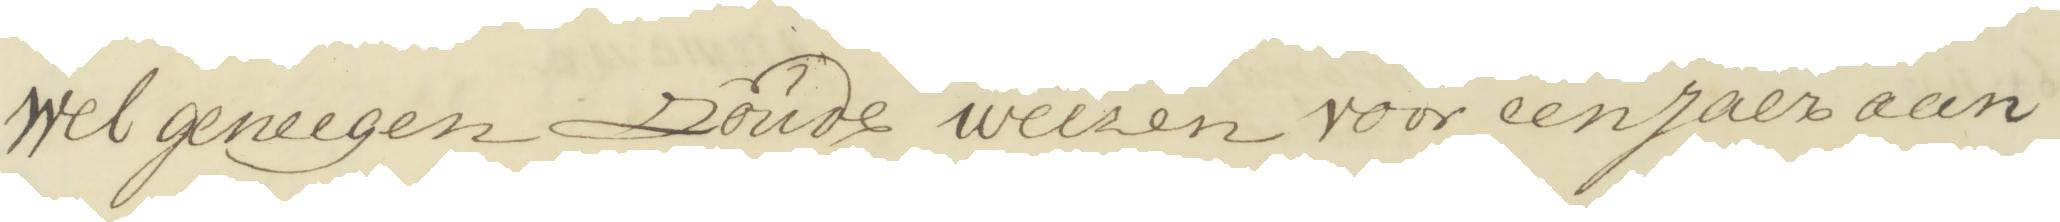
wel geneegen zoude weezen voor een jaer aan
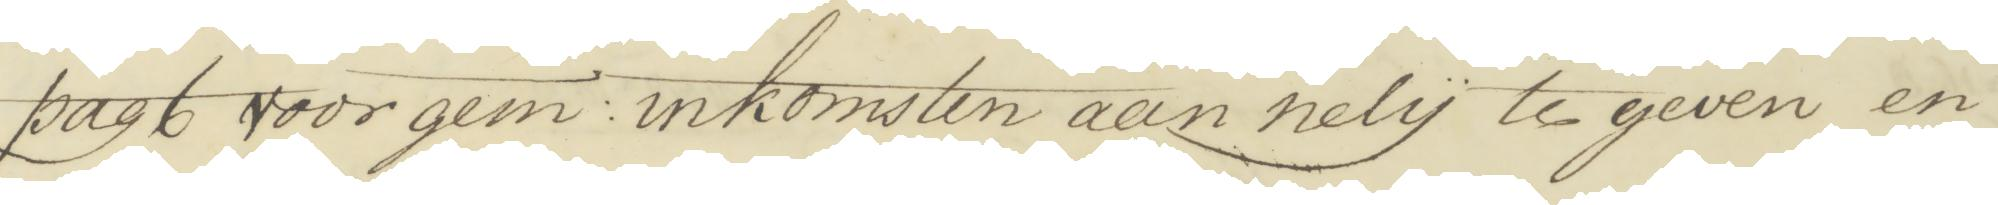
pagt voor gem: inkomsten aan nelij te geven en
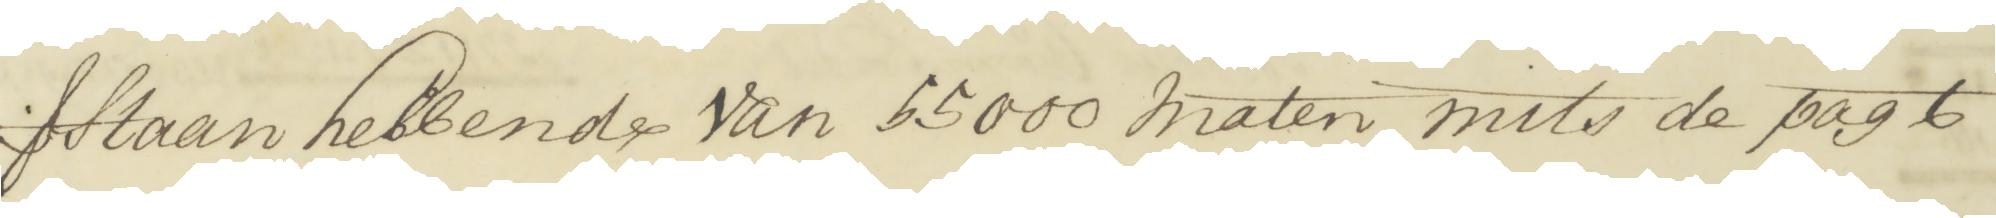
verstaan hebbende van 55000 maten, mits de pagt
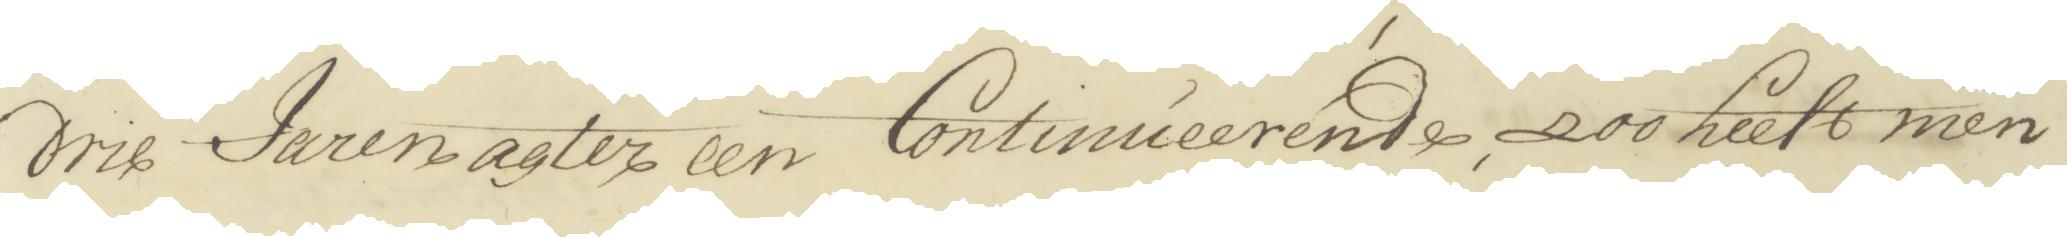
drie Iaren agter een Continueerende, zoo heeft men
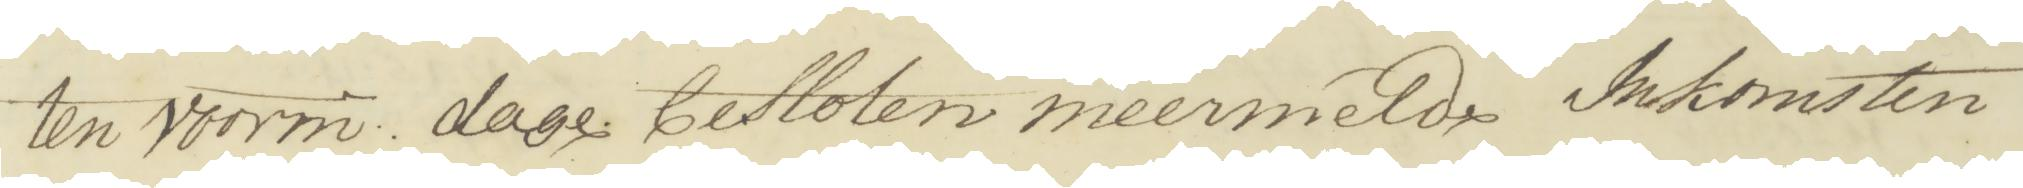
ten voorm: dage besloten meermelde Inkomsten
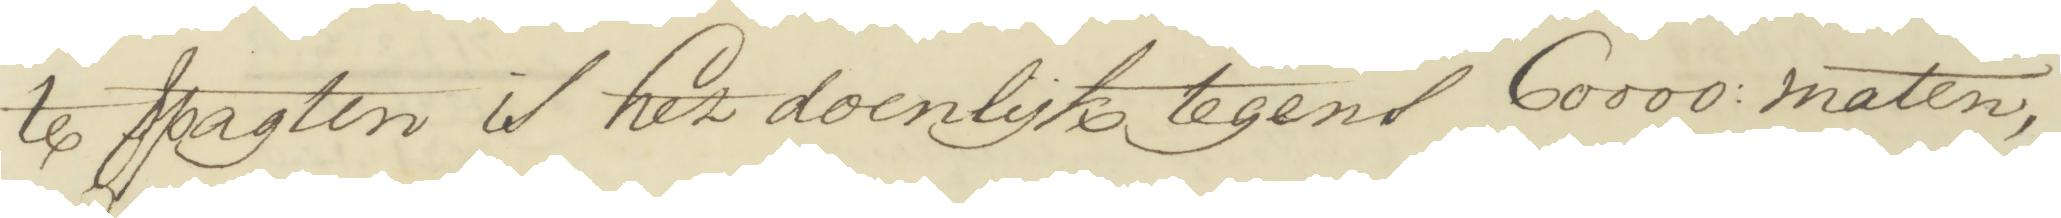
te verpagten is het doenlijk tegens 60000: maten,
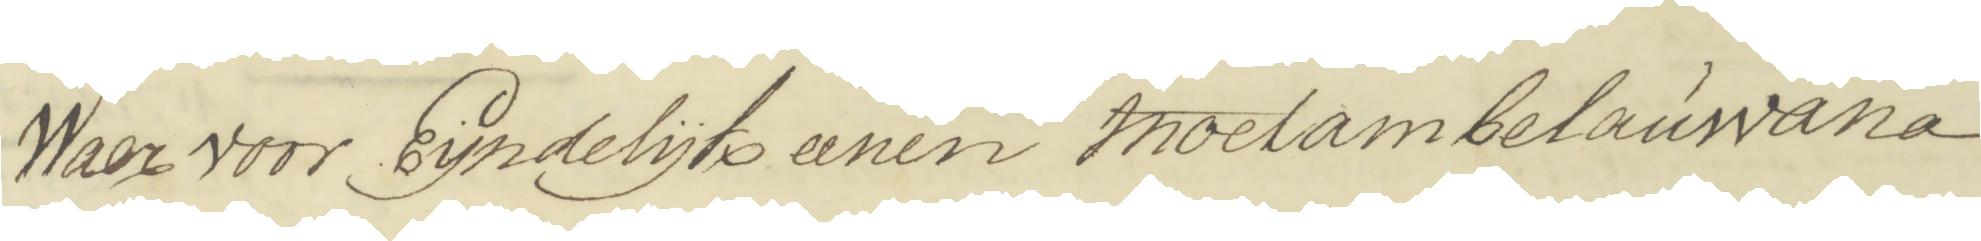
Waer voor Eijndelijk eenen moetambelauwana
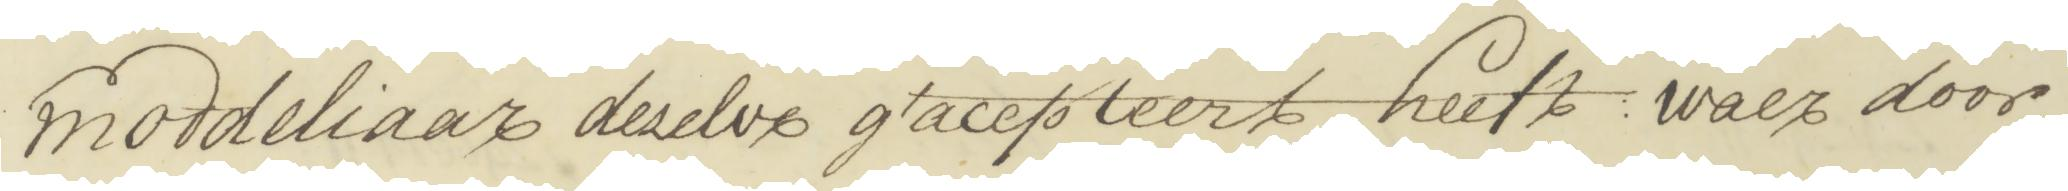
moddeliaar dezelve g'acepteert heeft: waer door
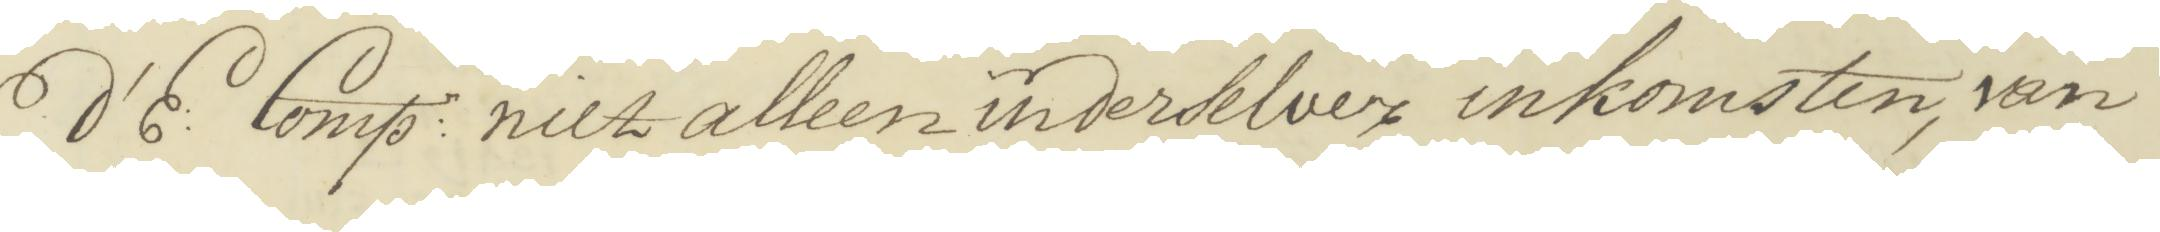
d’ E: Comp: niet alleen inderselver inkomsten, van
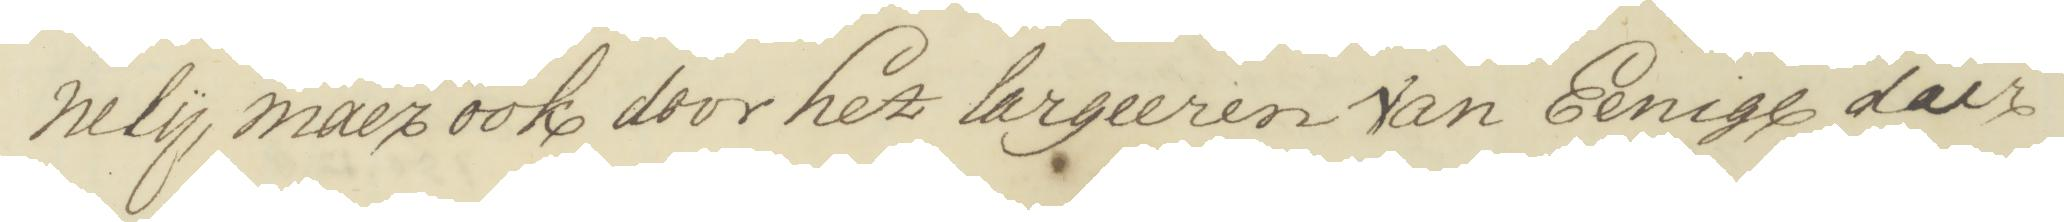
nelij, maer ook door het largeeren van Eenige daer
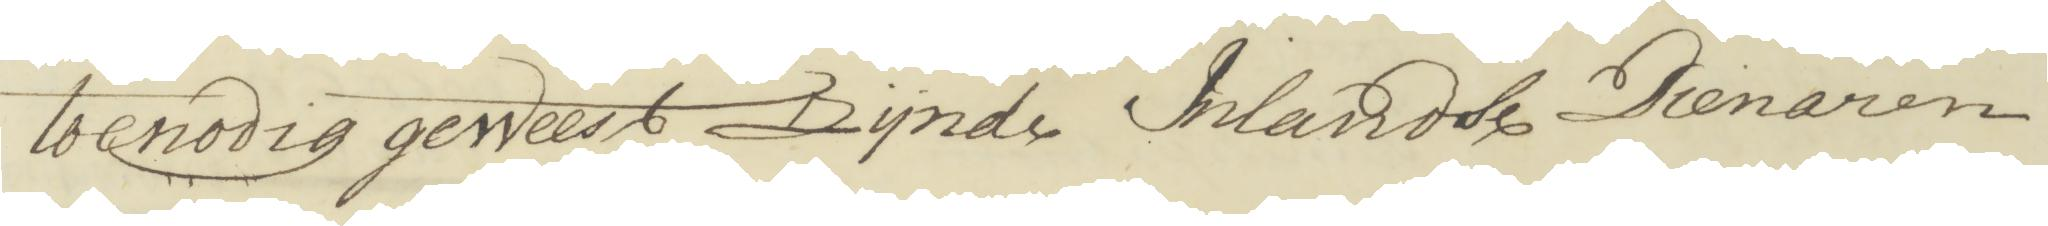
toenodig geweest zijnde Inlandse Dienaren
